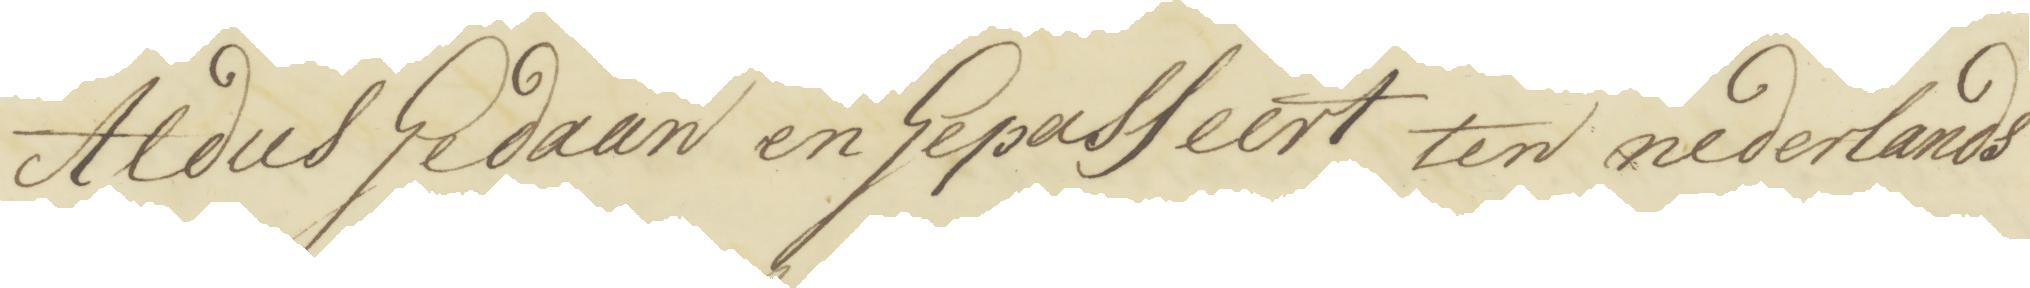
Aldus gedaan en gepasseert ten nederlands
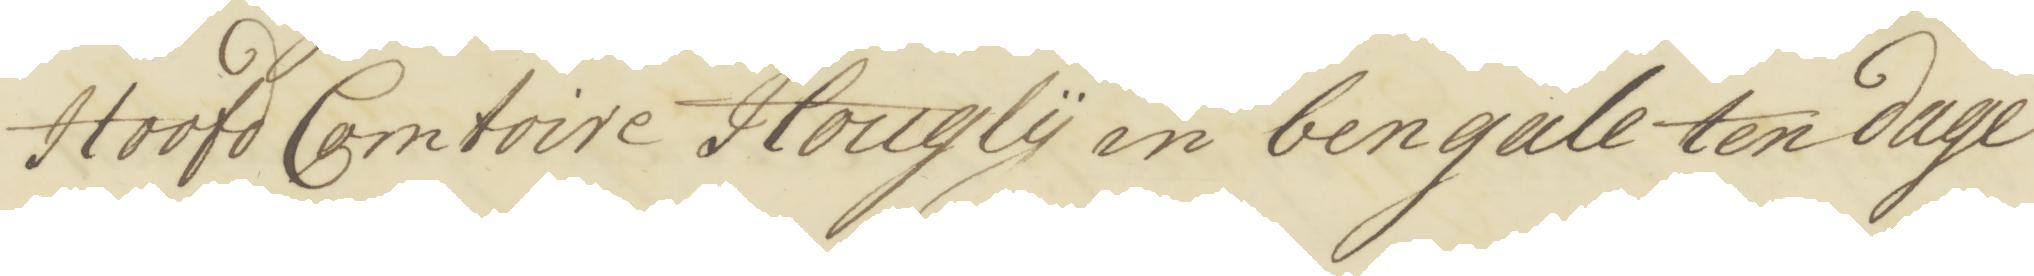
Hoofd Comtoire Houglij in bengale ten dage
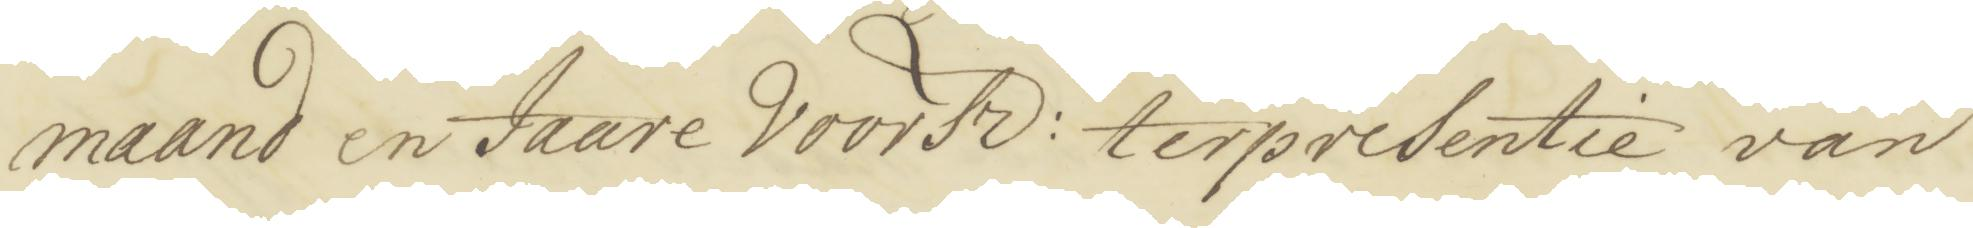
maand en Jaare Voorsz: terpresentie van
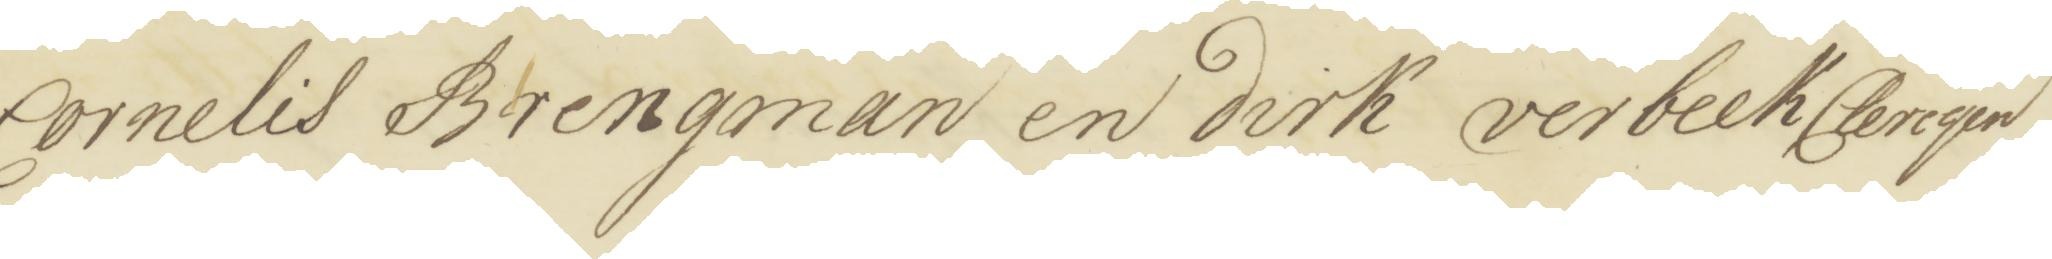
Cornelis Brengman en dirk verbeek Clercqen
